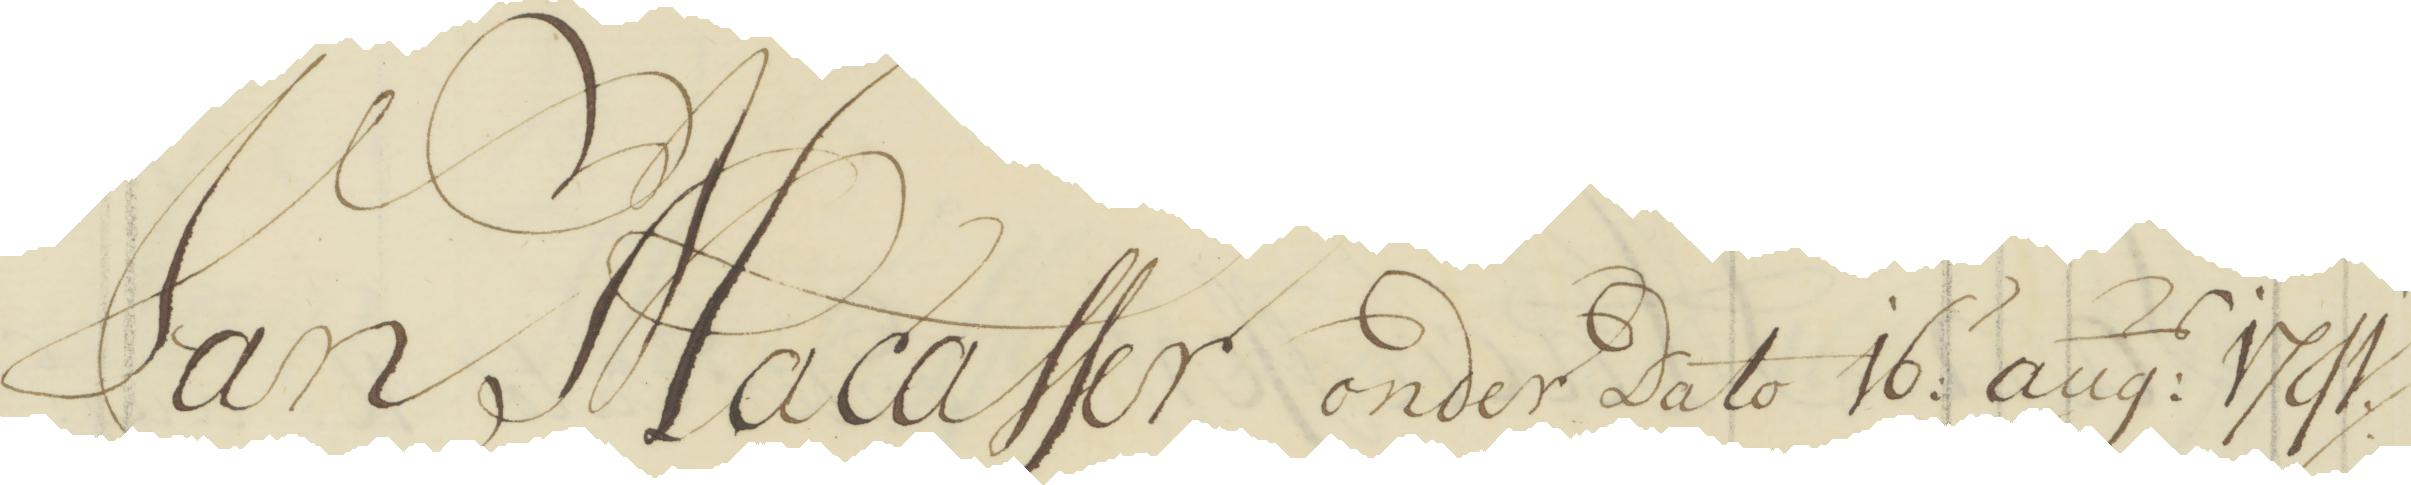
Van Macasser onder dato 16: aug:s 1741./.
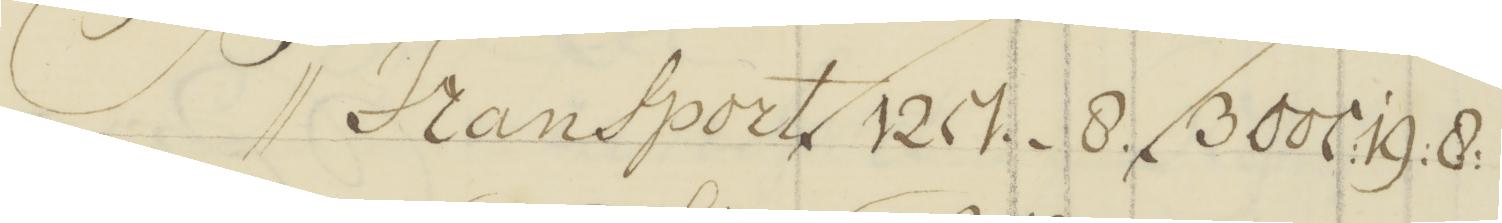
P„r Transport f 1251.- 8. ƒ 3005:19:8:
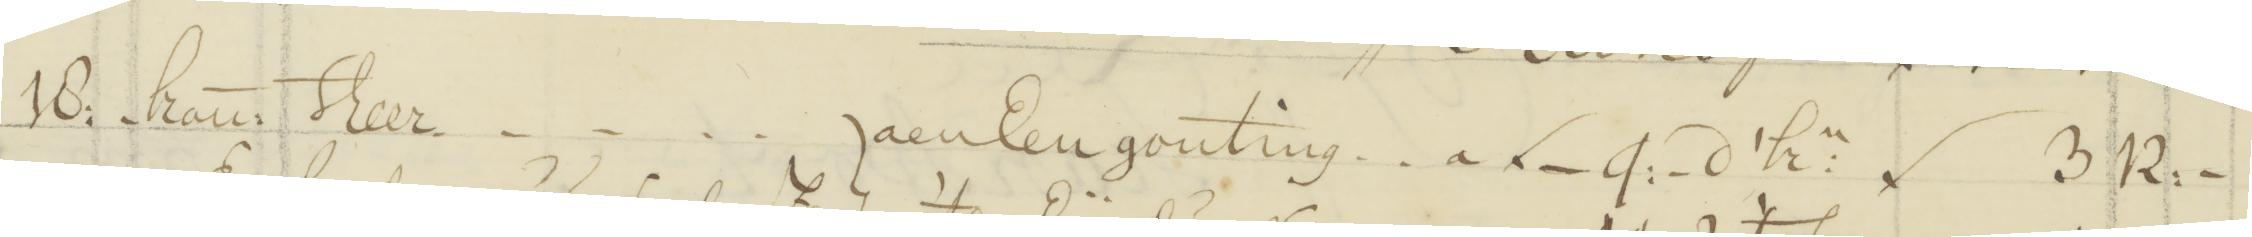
18: kan: theer - - . - aen Een gonting .. a ƒ—4:—d 'k:n f 3 12.-
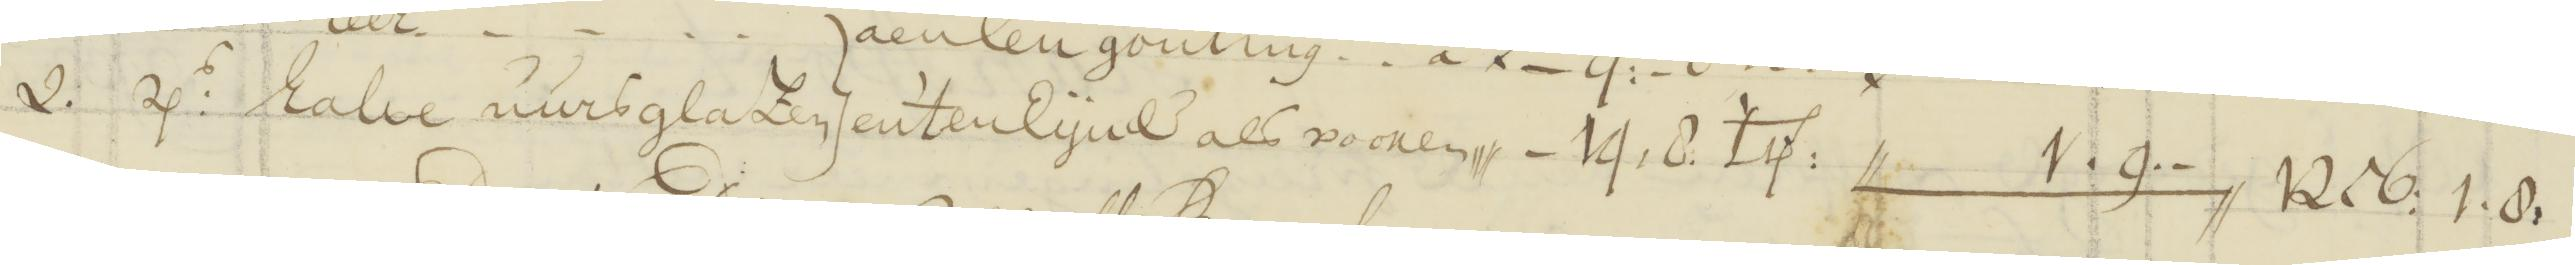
2: p:s halve uursglazen en'tenEijnde als vooren„„ — 14:8: 't p:s „ 1:9.- „ 1256: 1.8:
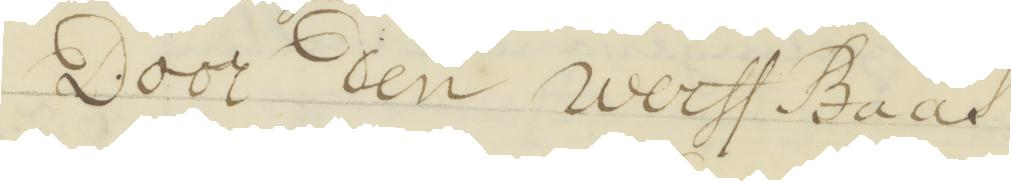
Door den werff Baas
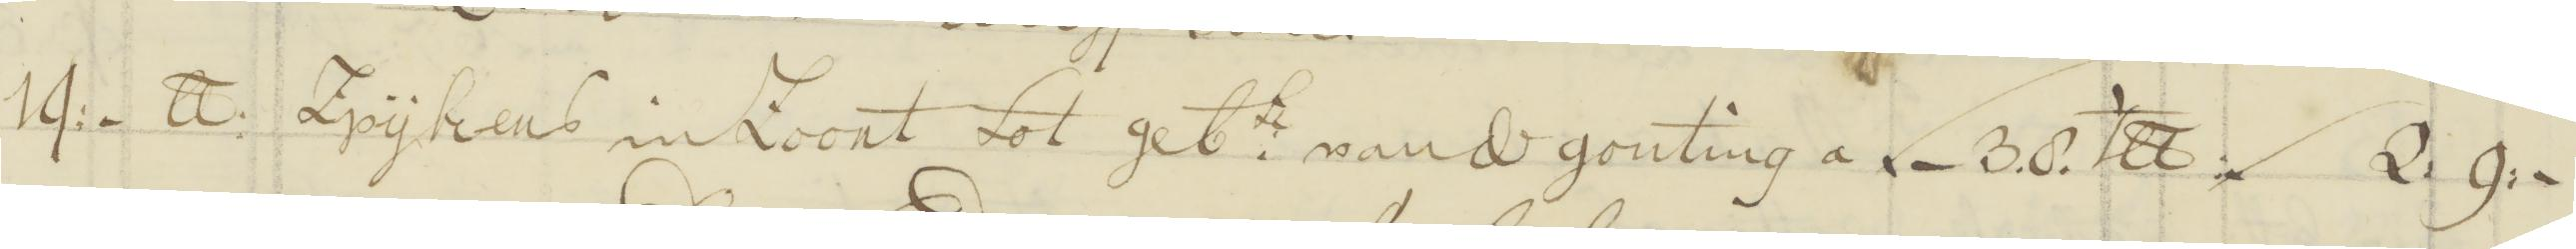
14:- lb: zpijkers inzoort tot geb:k van de gonting a ƒ — 3.8. 'tlb:ƒ 2:9:-
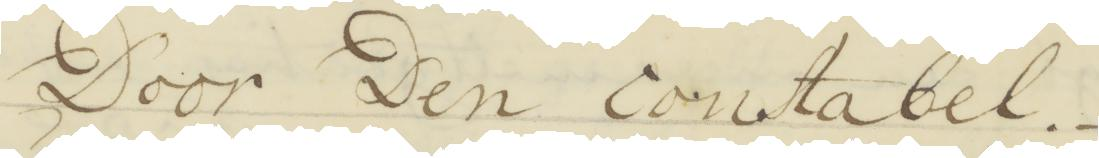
Door Den constabel.-
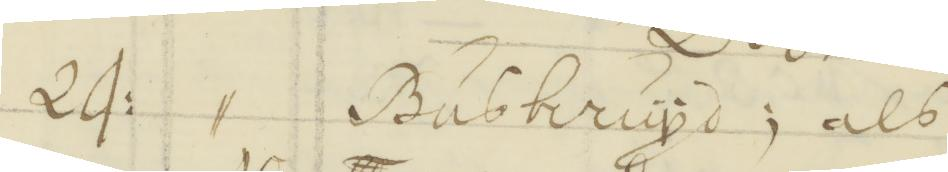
24: „ Buskruijd; als
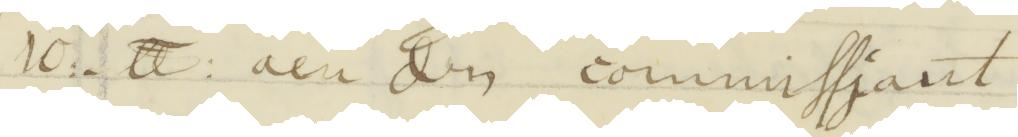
10:- lb: aen den commissjant
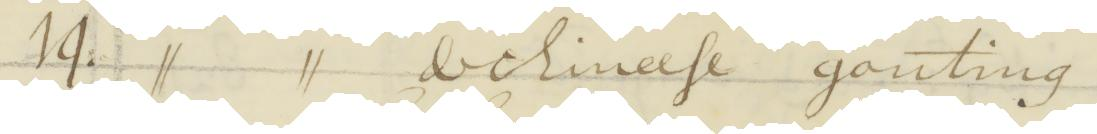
14: „ „ de chineese gonting
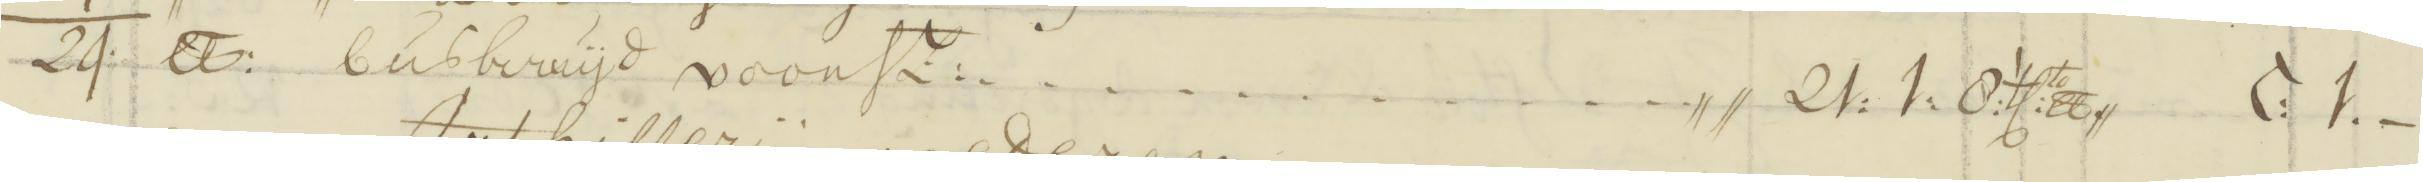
24: lb: buskruijd voorsz: - - . - . - - - - - - .„ „ 21:1:8:'tC:to lb.„ 5: 1.-
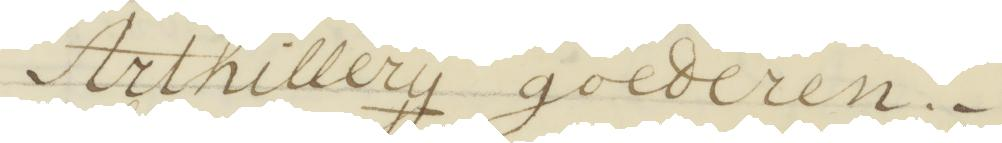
Arthillerij goederen.-
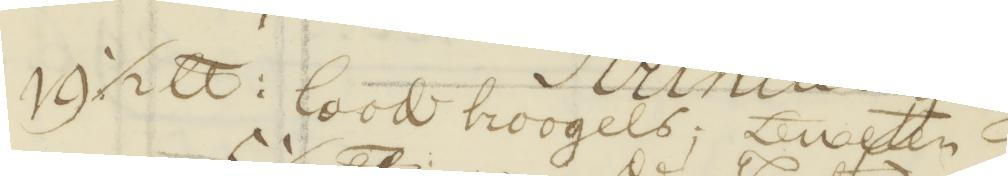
19½ lb: loode koogels; teweten
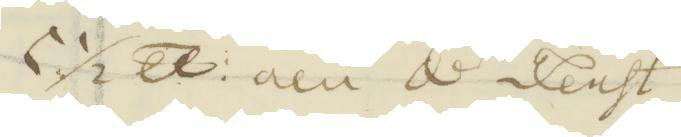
5½ lb: aen de Eerst
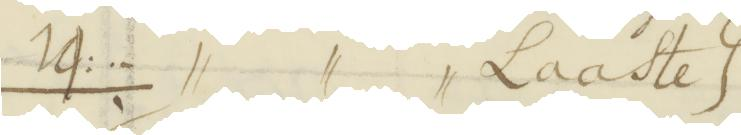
14:.- „ „ „ Laaste
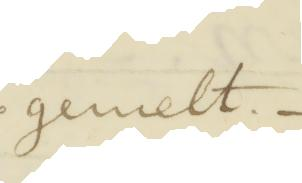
gemelt.-
